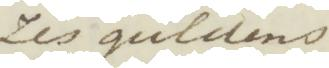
zes guldens
